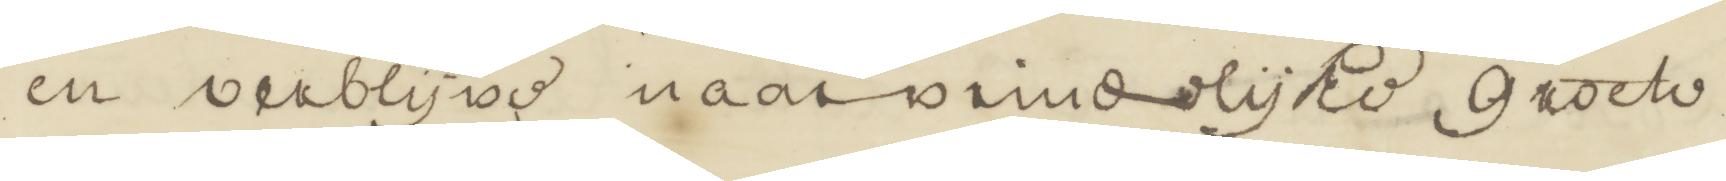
en verblijve naar vrindelijke groete
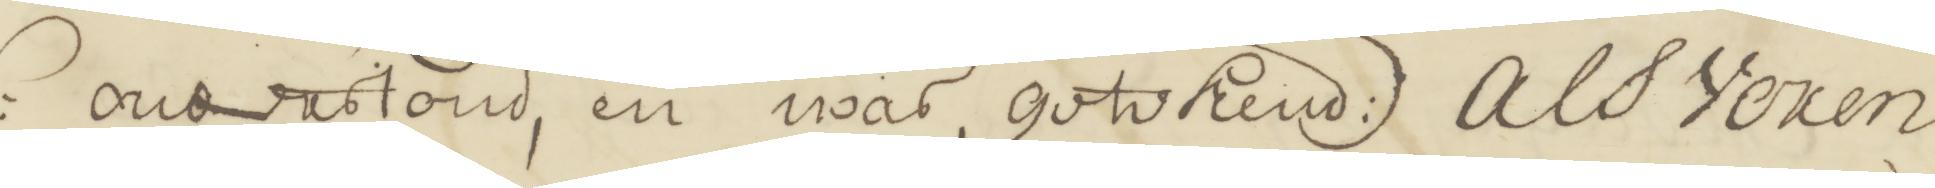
(:onderstond, en was getekend:) als voren
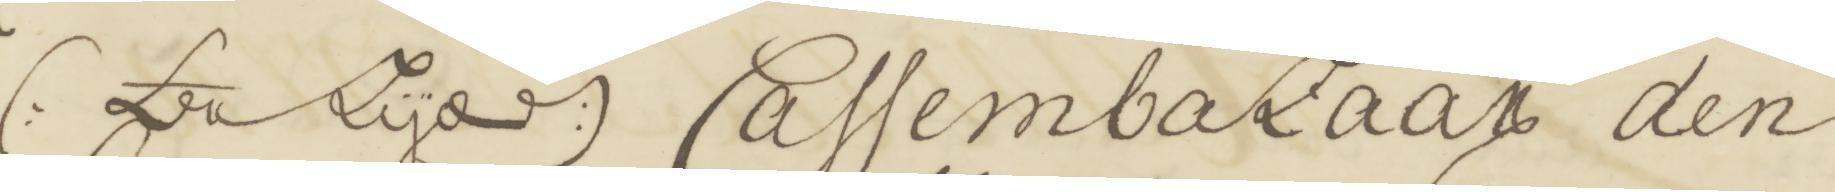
(:ter zijde:) Cassembazaar den
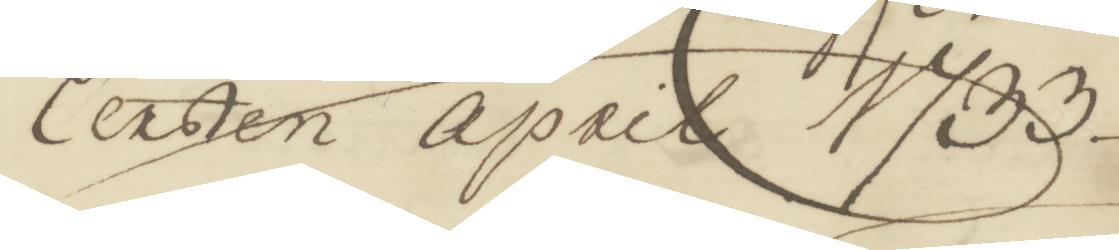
Eersten april 1733.
